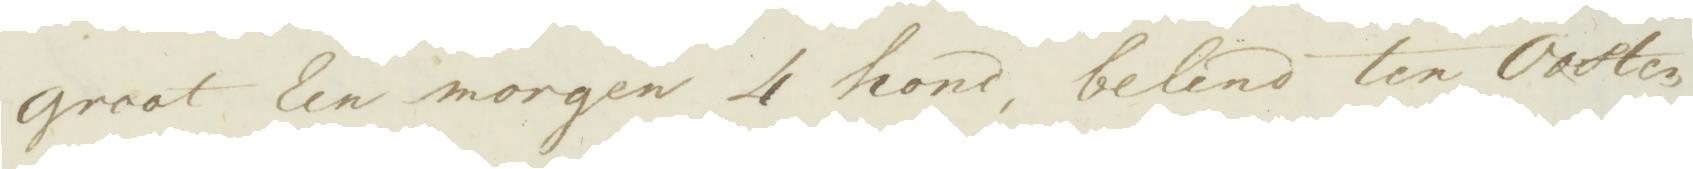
groot Een morgen 4 hond, belend ten Oosten
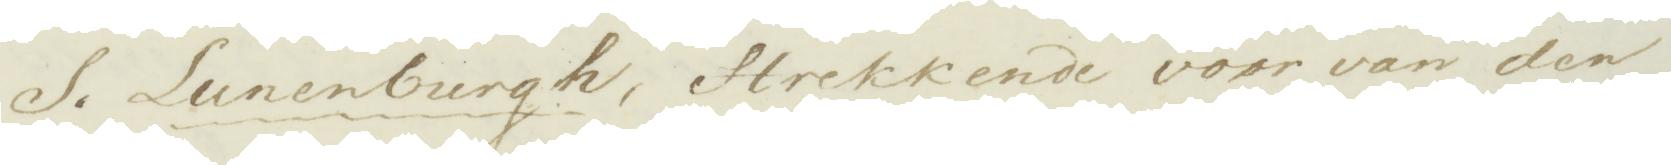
S. Lunenburgn, strekkende voor van den
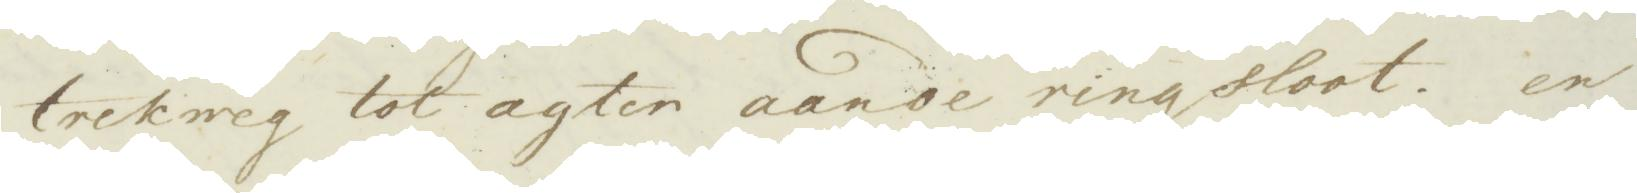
trekweg tot agter aan de ringsloot. en
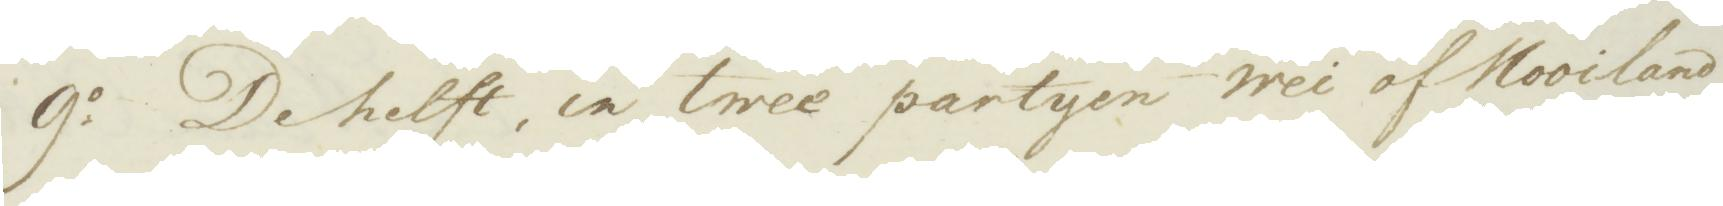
9„0 De helft, in twee partijen wei of Hooiland
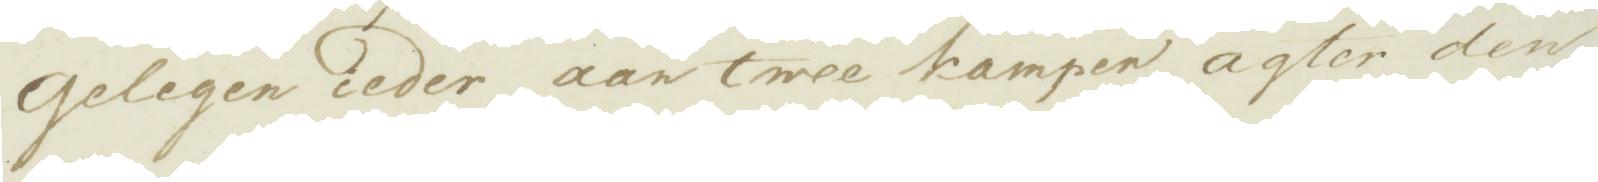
gelegen ieder aan twee kamper agter den
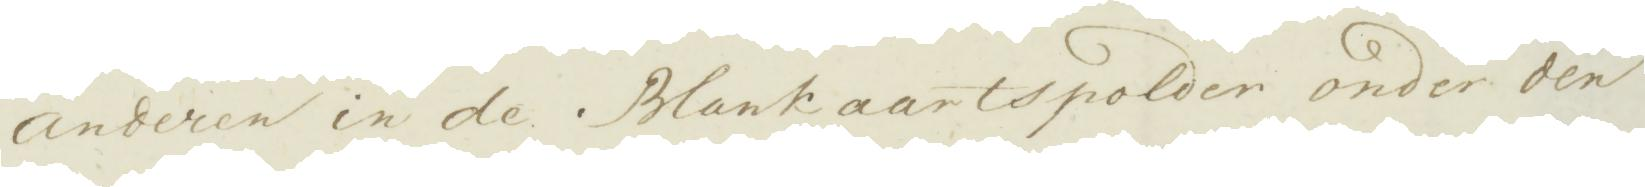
anderen in de Blankaartspolder onder den
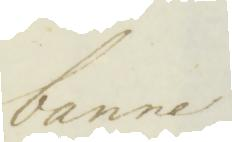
banne
